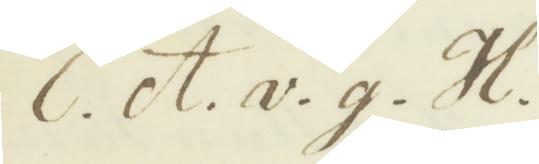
C. A. v. g. H.
